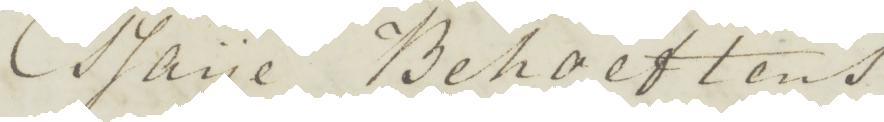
Essaije Behoeftens
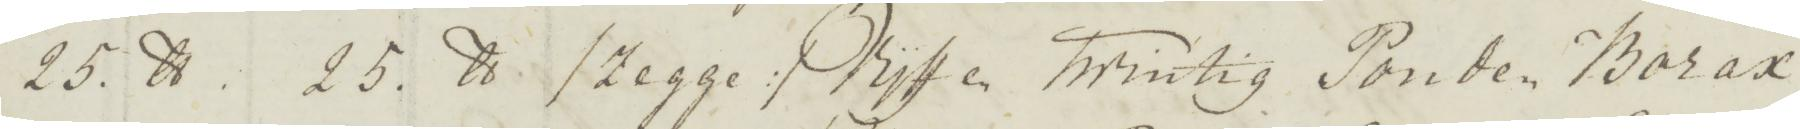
25. lb 25. lb /zegge:/ Vijf en Twintig Ponden Borax
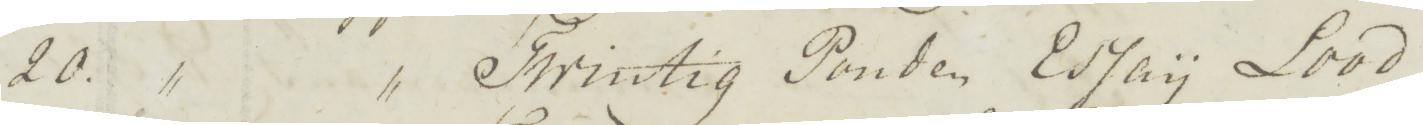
20. „ „ Twintig Ponden Essaij Lood
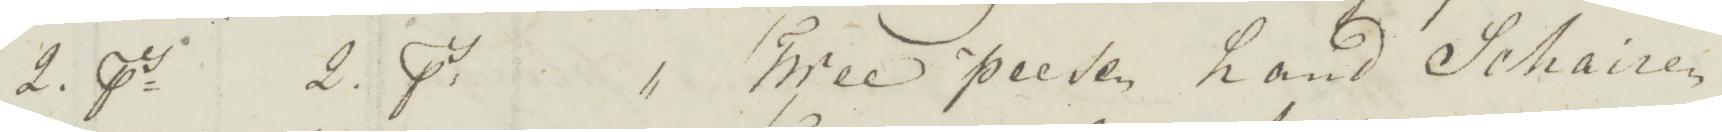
2. p=s 2. p„s „ Twee peesen hand Schairen
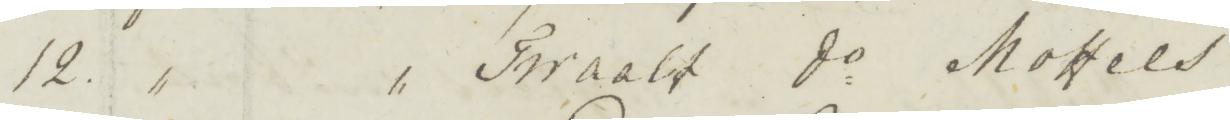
12. „ „ Twaalf d:o Moffels
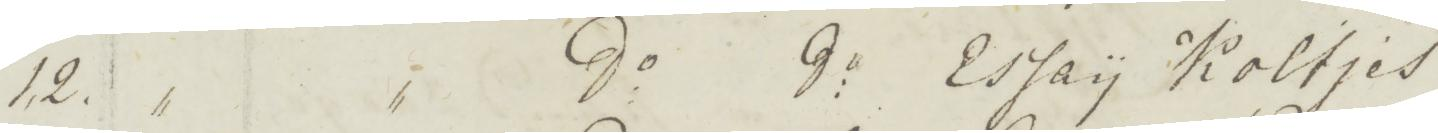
12. „ „ d:o d:o Essaij Kolfjes
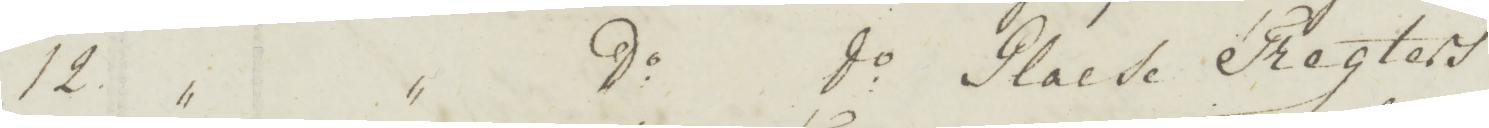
12. „ „ d:o d:o Glaese Tregters
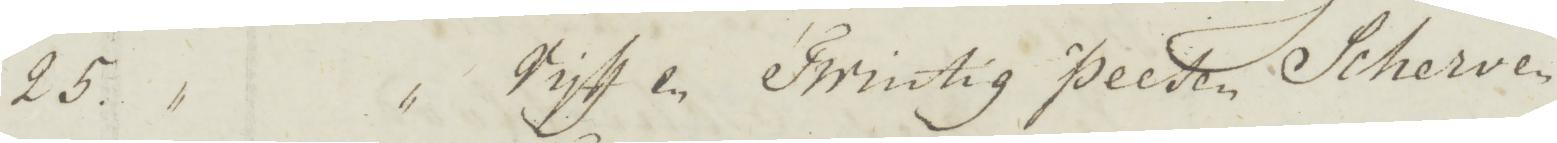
25. „ „ Vijff en Twintig peesen Scherven
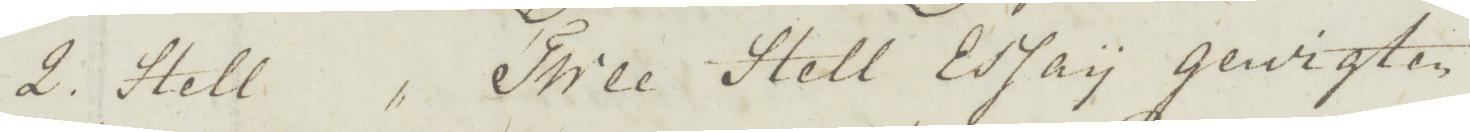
2. Hell „ Twee Stell Essaij gewigten
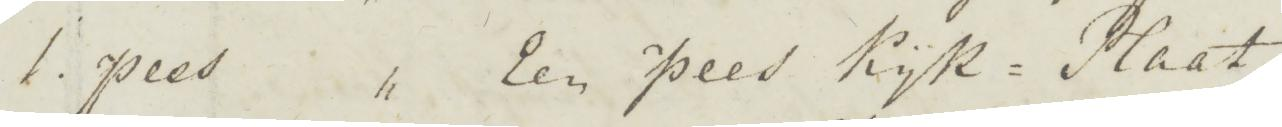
1. pees „ Een pees Kijk=Plaat.
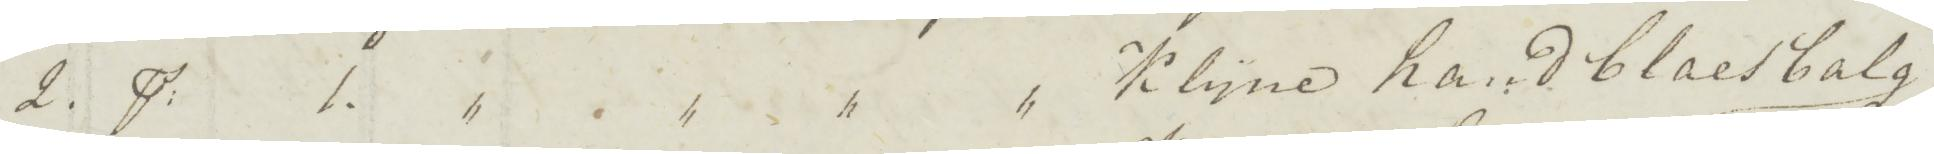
2. p:s 1. „ „ „ „ klijne hand blaesbalg
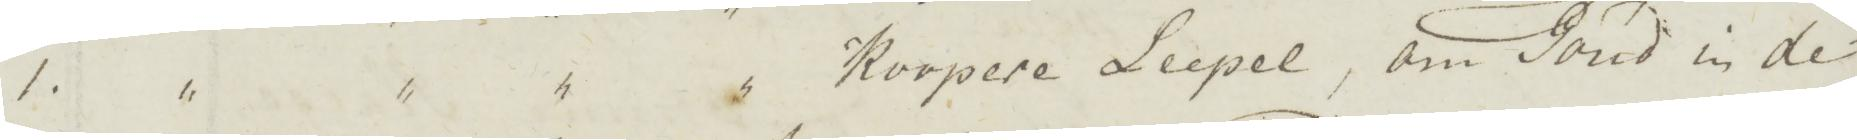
1. „ „ „ „ Koopere Leepel, om Soud in de
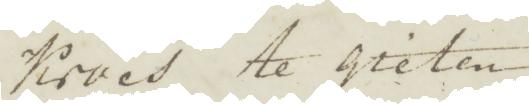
Kroes te gieten
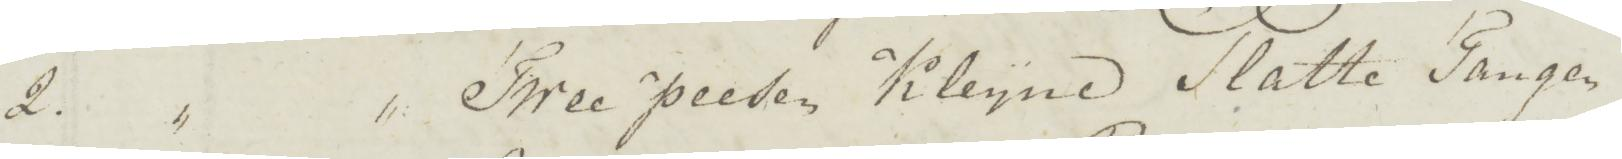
2. „ „ Twee peesen Kleijne Platte Tangen
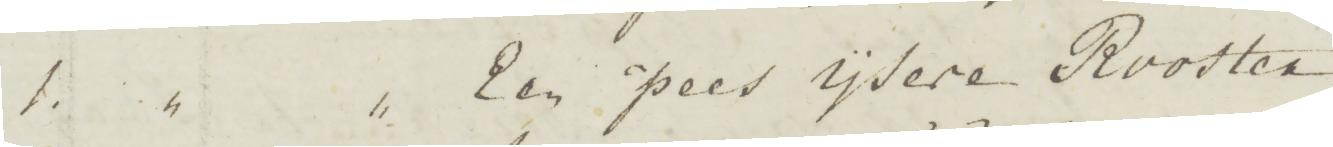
1. „ „ Een pees ijsere Rooster
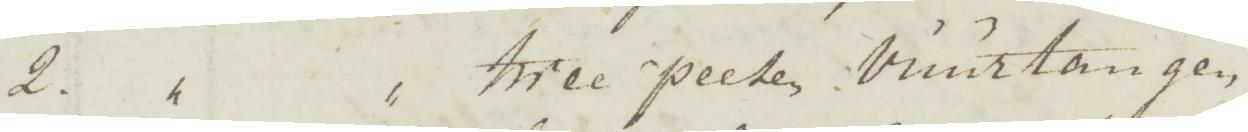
2. „ „ twee peesen Vuurtangen
